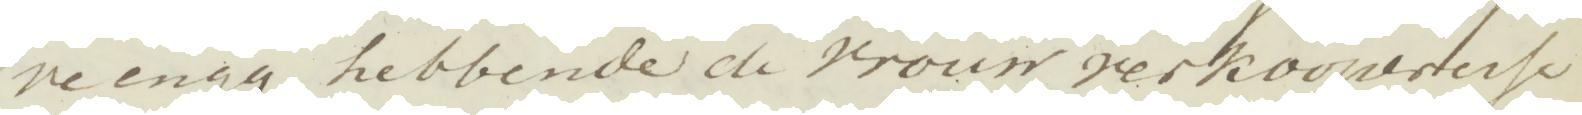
ve engg, hebbende de Vrouw verkooperesse
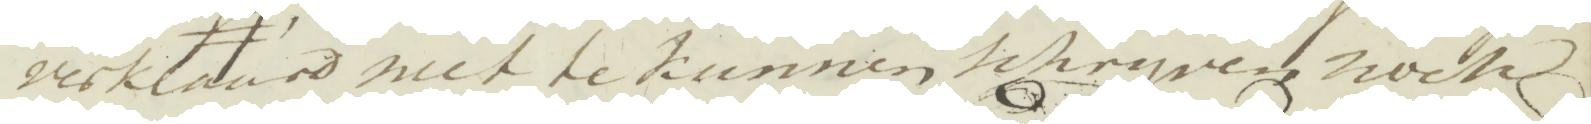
verklaard niet te kunnen schryven noch
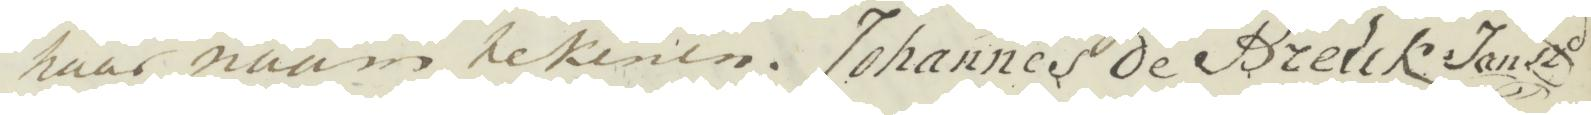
haar naam tekenen. Johannes de Breuk Iansz
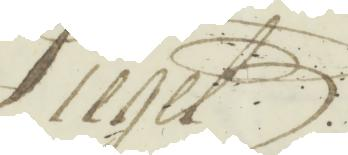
J:"F: Siegel
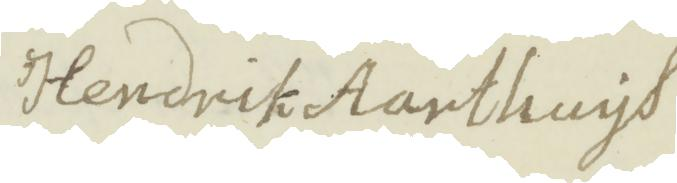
Hendrik Aarthuijs
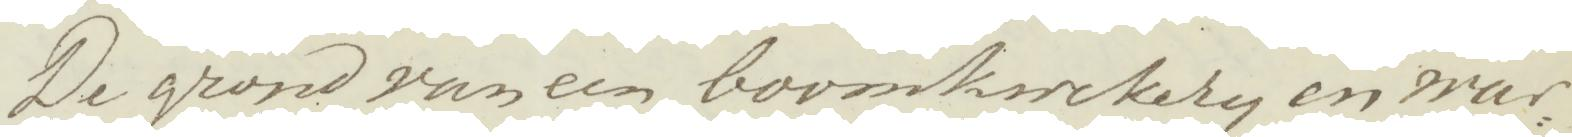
De grond van een boomkwekery en war=
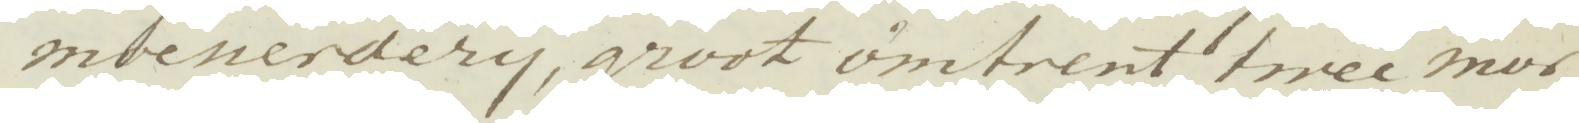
moesierdery, groot omtrent twee mor=
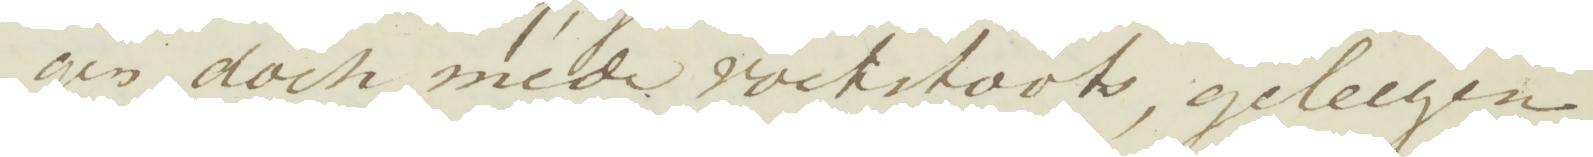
gen, doch mede voetstoots, geleegen
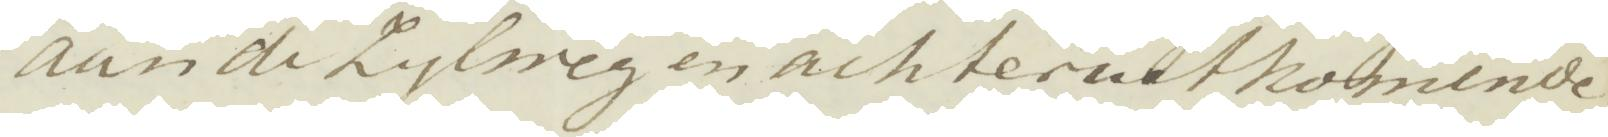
aan de Zijlweg en achteruitkomende
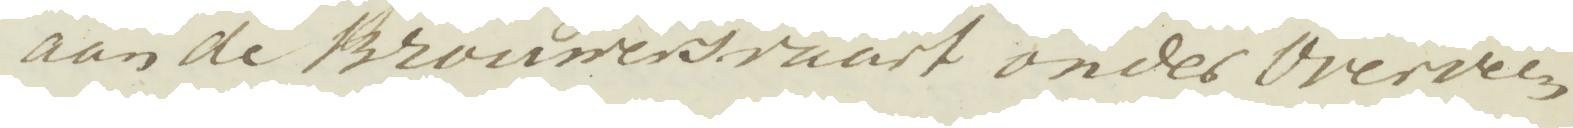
aan de Brouwersvaart onder Overveen
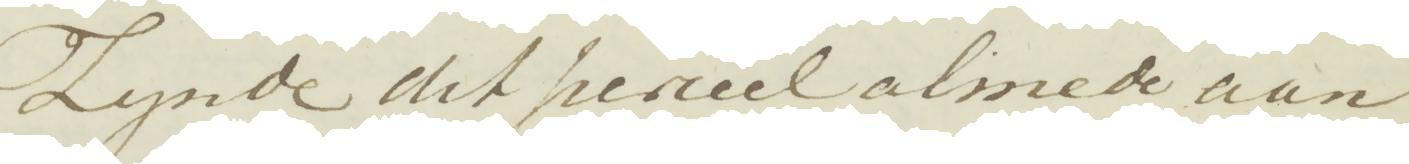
Zynde dit perceel almede aan
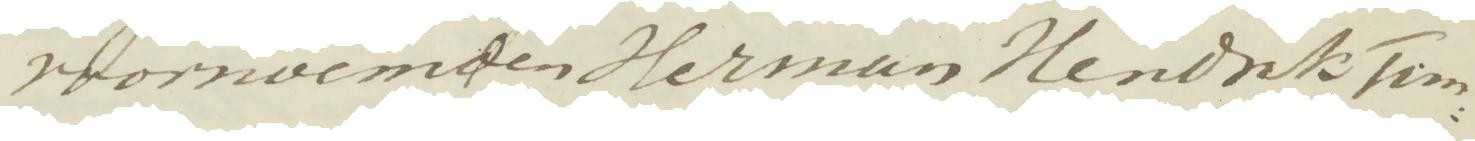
voornoemden Herman Hendrik Tim:
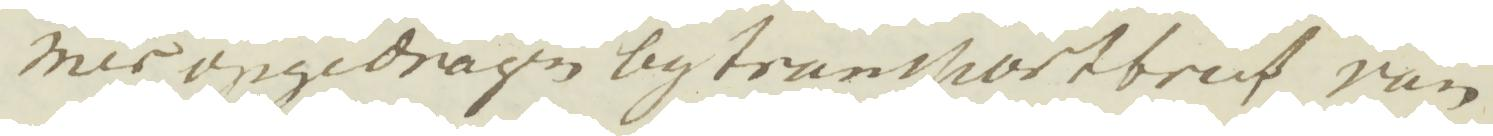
mer opgedragen by transportbrief van
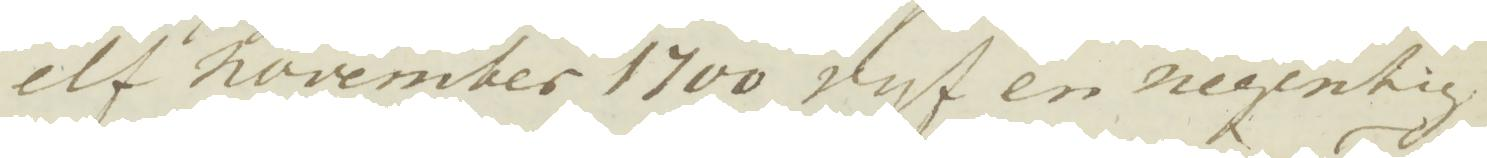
elf November 1700 vyf en negentig
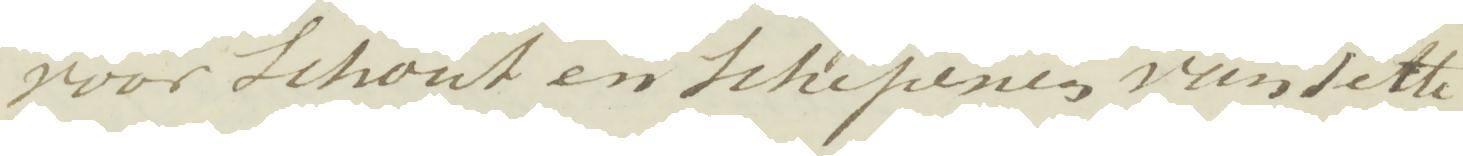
voor schout en schepenen van Tette
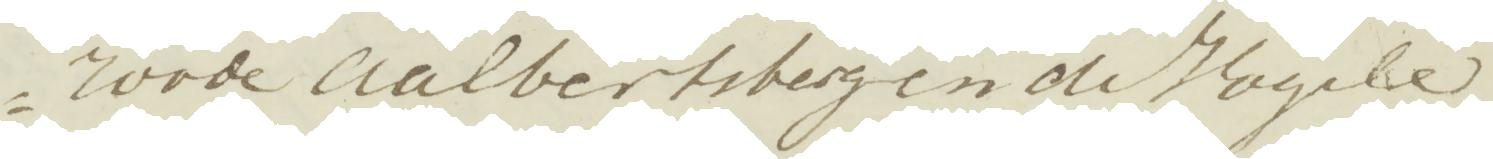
= roode Aalbertsberg en de Vogele
